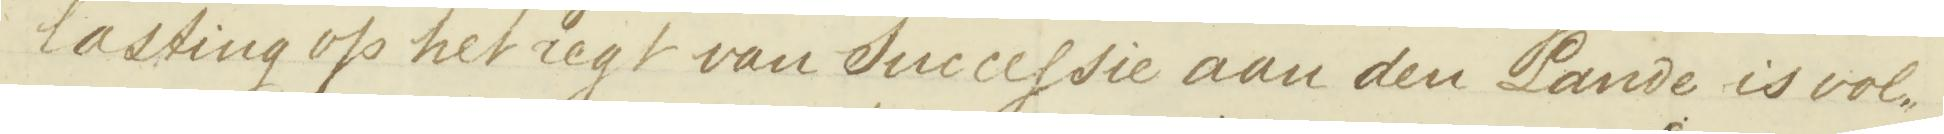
lasting op het regt van successie aan den Lande is vol„
